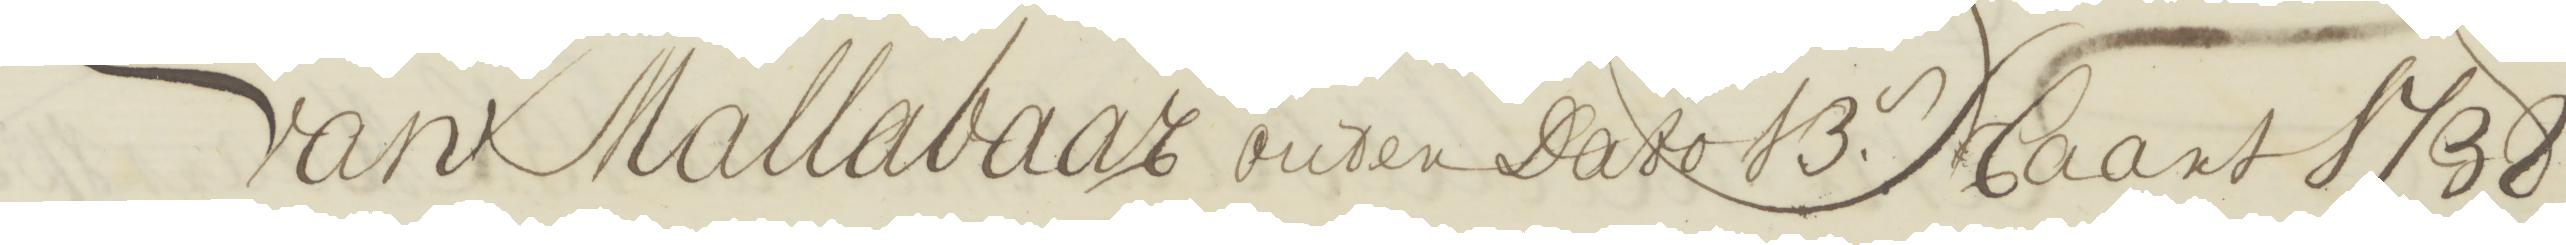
Van Mallabaar onder Dato 13:~ Maart 1738
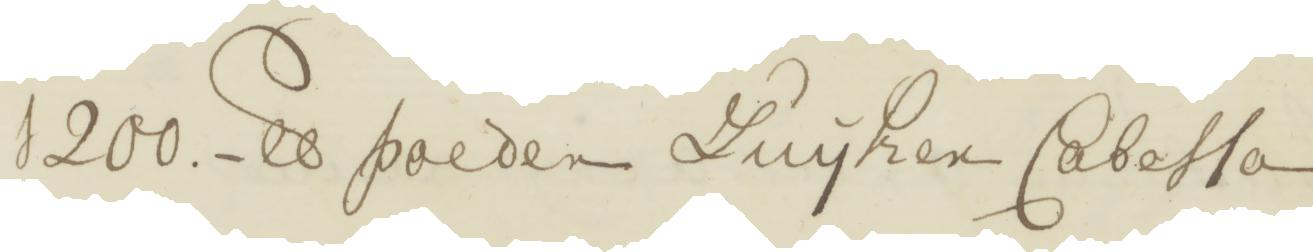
1200.- lb poeder zuijker Cabessa
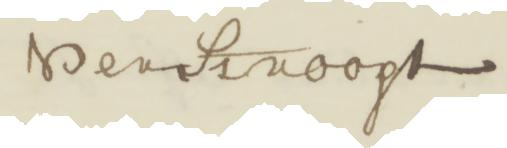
verstroopt
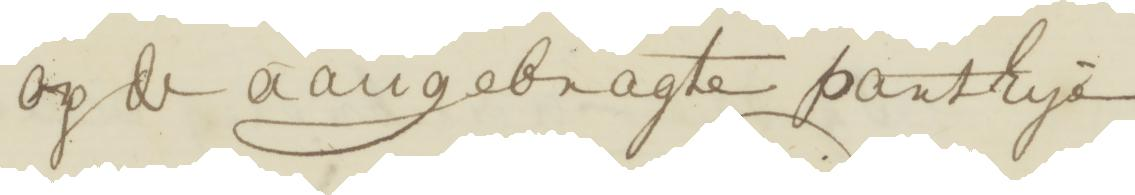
op de aangebragte parthije
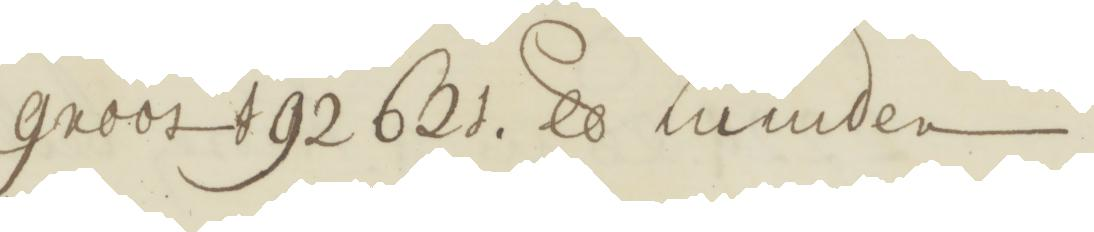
groot 192621. lb minder
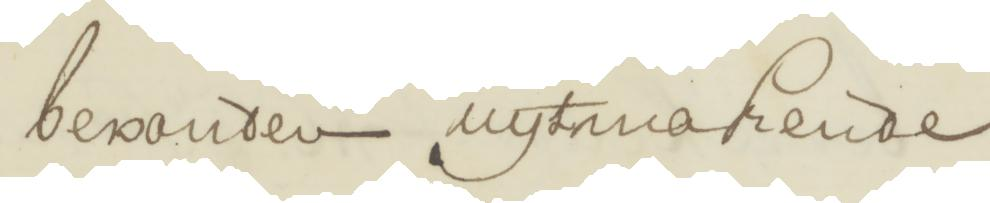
bevonden uijtmakende
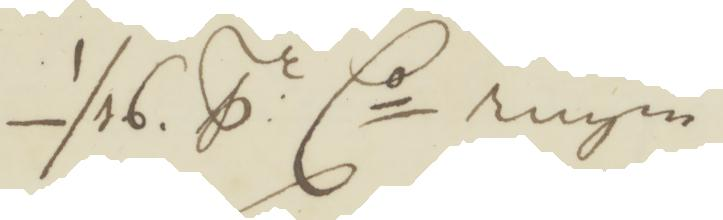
—1/16. p:r C=o ruijm
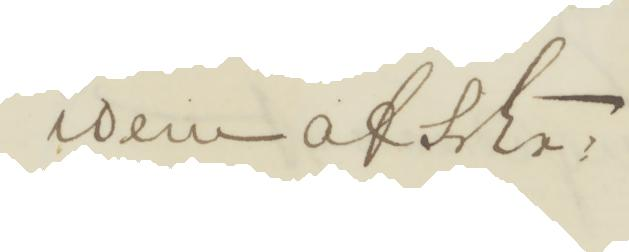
idem afschr:
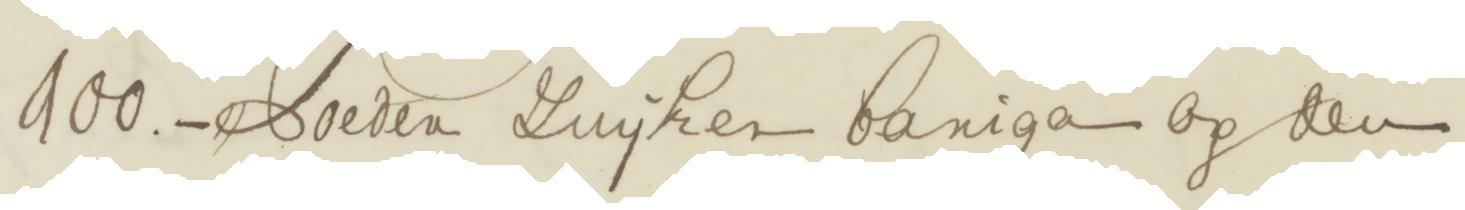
400.– Poeder zuijker bariga op den
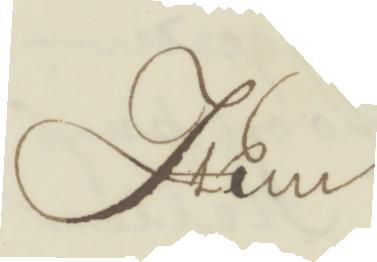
Item
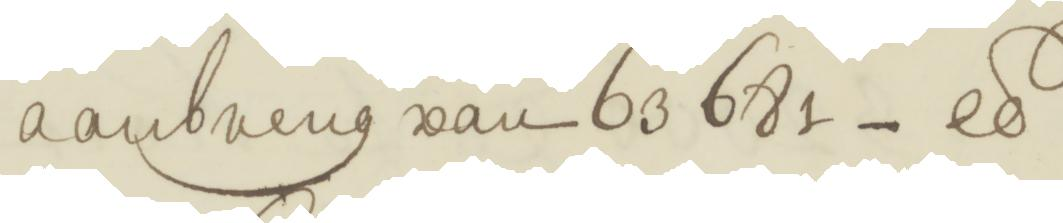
aanbreng van 63681- ed
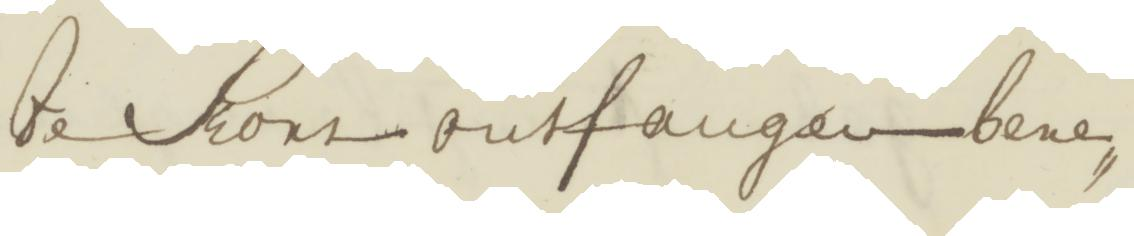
te kort ontfangen bere„
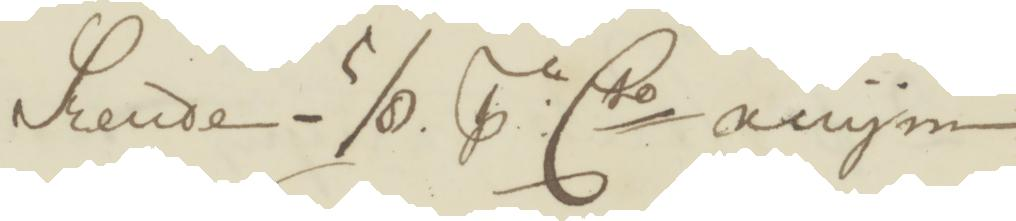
kende - 5/8. p:r C=to ruijm
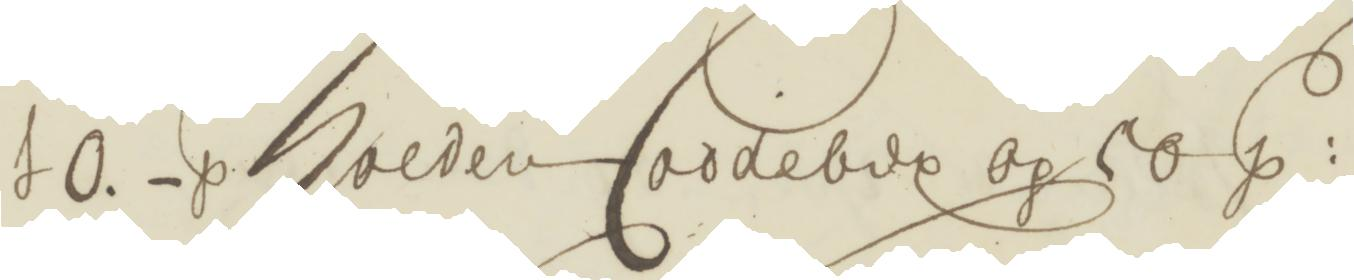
10. –p Hoeden Coddebex op 50 p:s
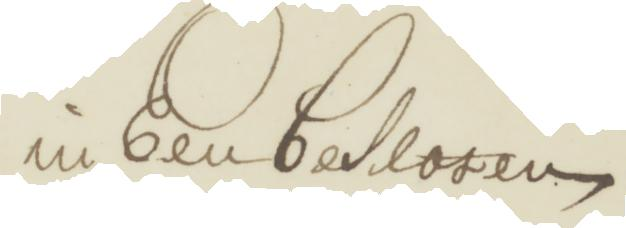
in Een besloten
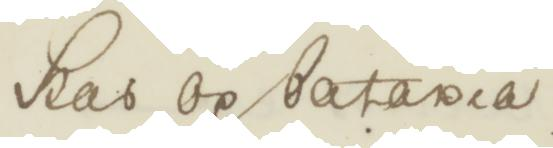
kas op batavia
